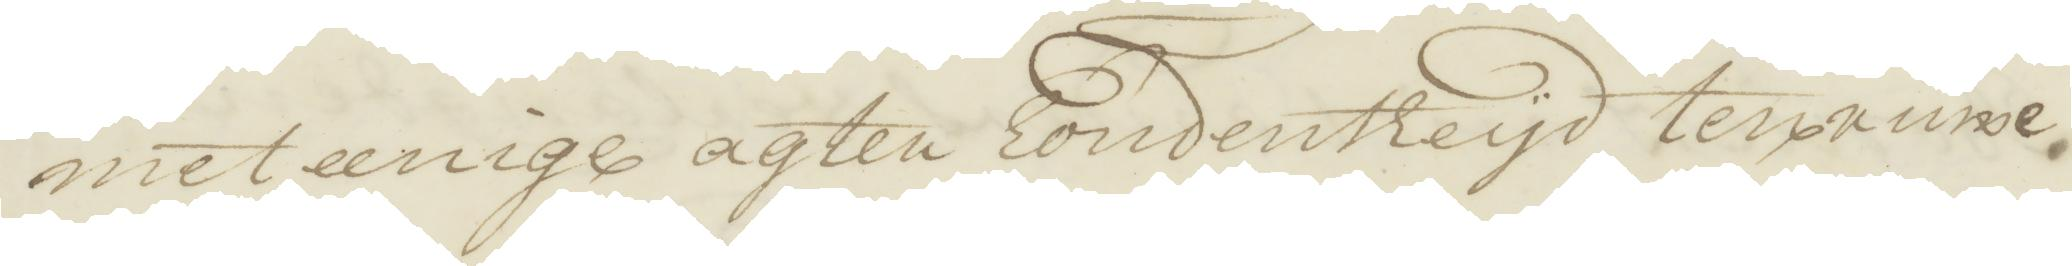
met eenige agter houdentheijd terpruwe„
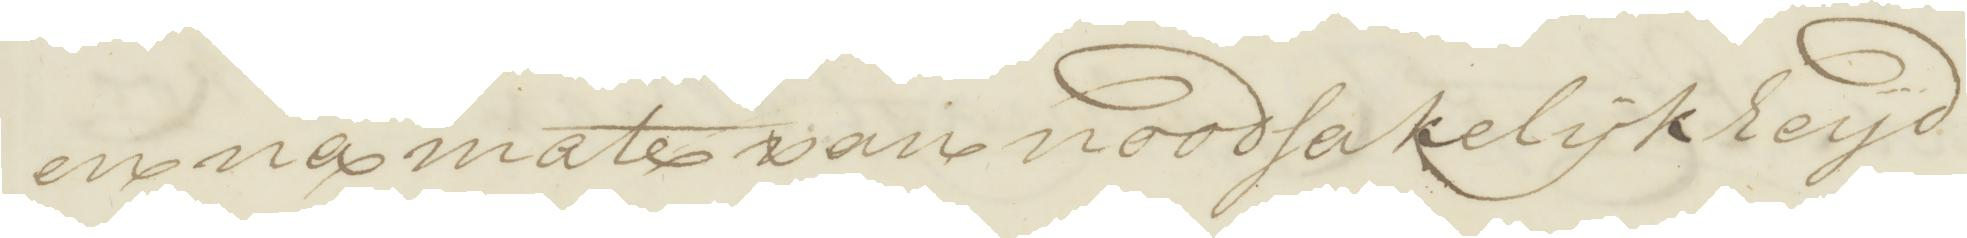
en na mate van noodsakelijkheijd
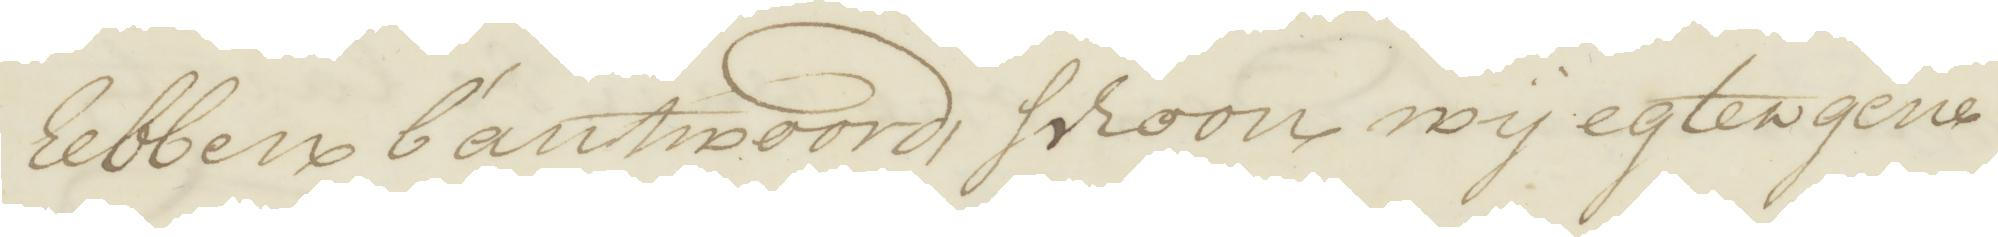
hebben b'antwoord, schoon wij egter gene
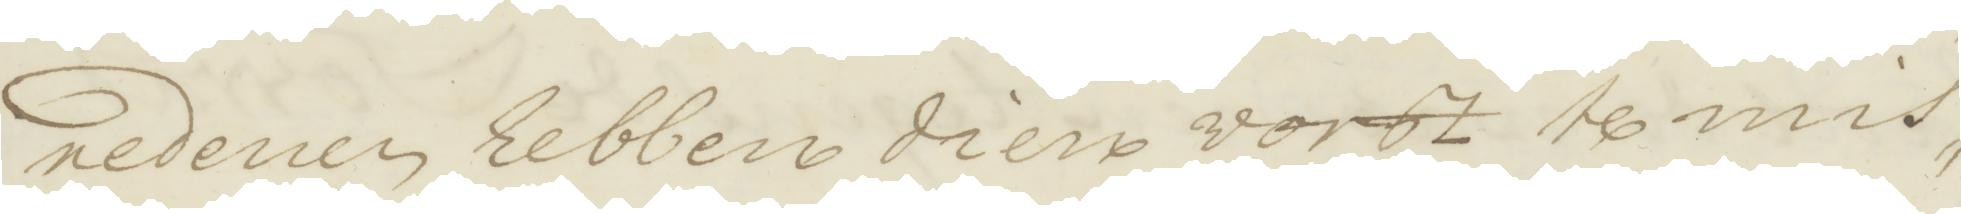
redenen hebben dien vorst te mis„
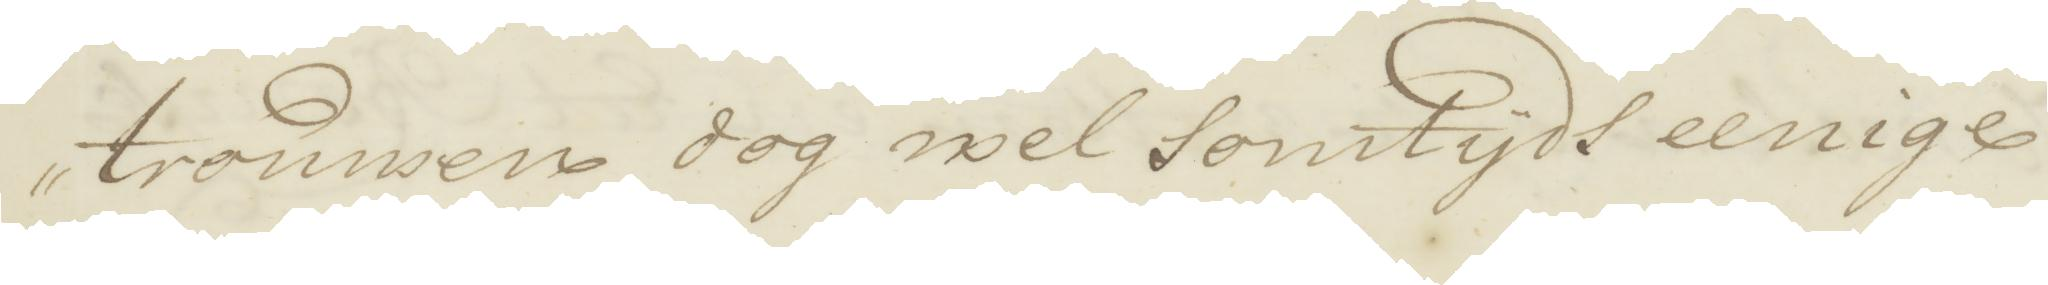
„trouwen dog wel somtijds eenige
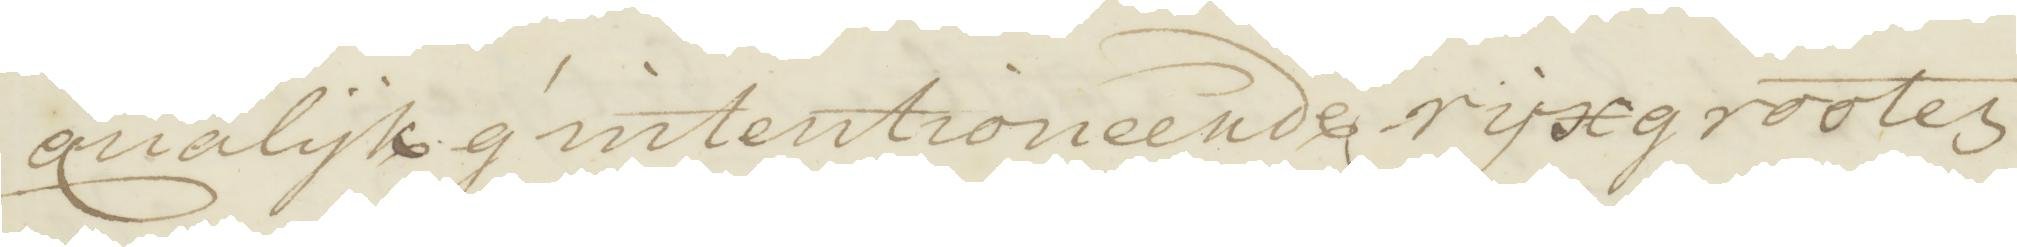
qualijk g’ intentioneerde rijxgrooten
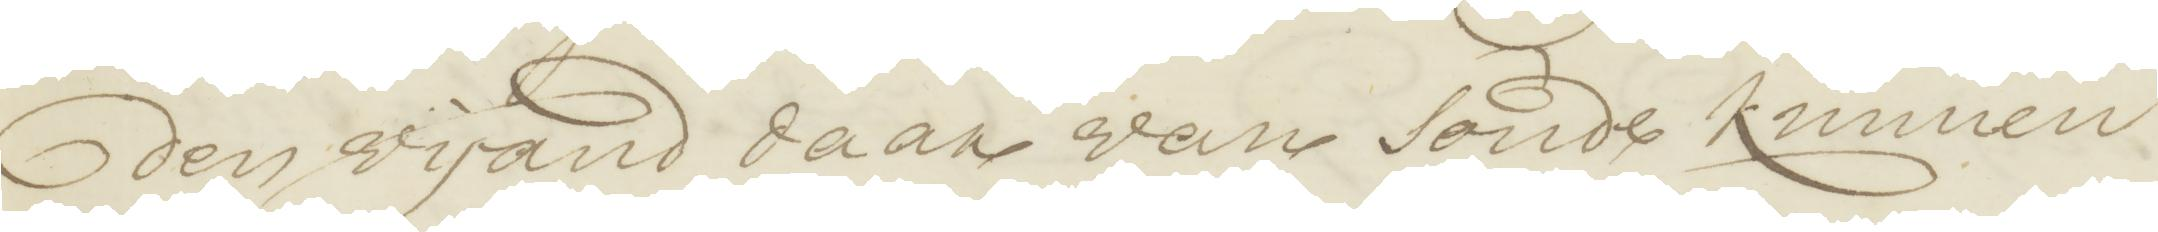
den vijand daar van soude kunnen
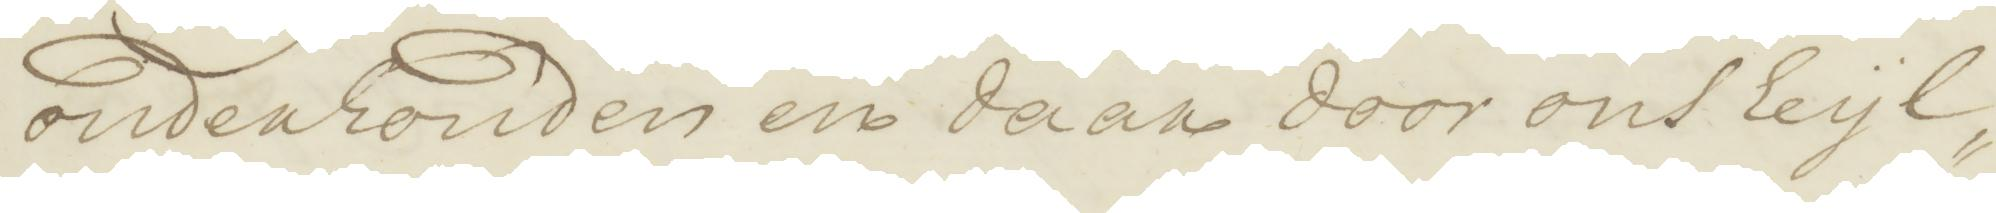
onderhouden en daar door ons heijl„
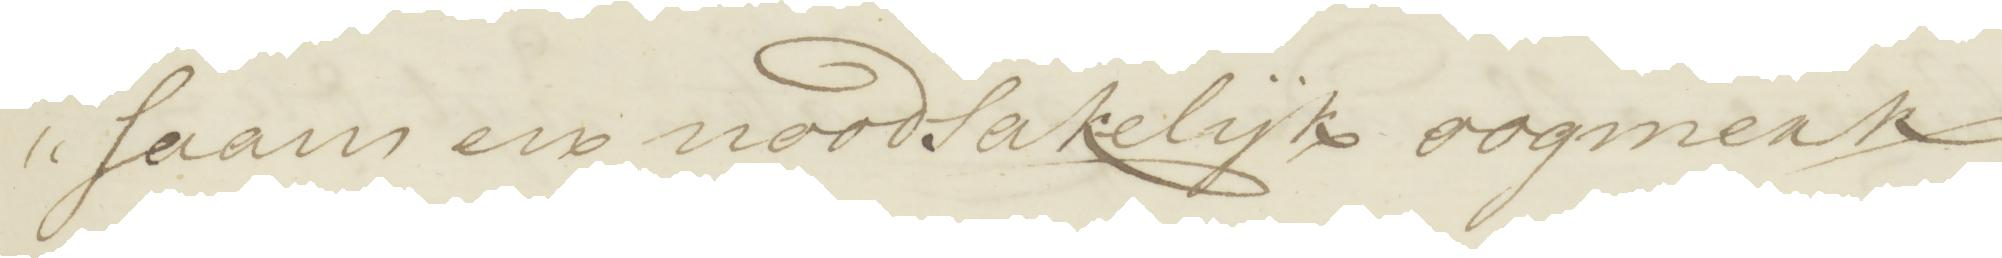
„saam en noodsakelijk oogmerk
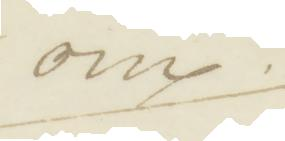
om:
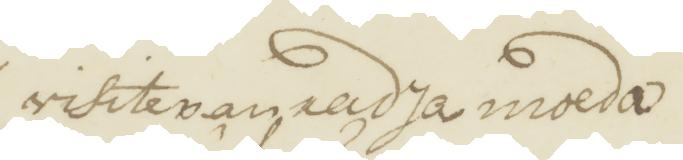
visitevan radja moeda
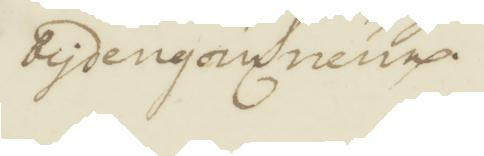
bijden gouverneur.
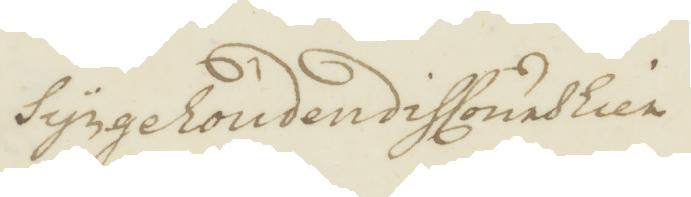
sijn gehouden disourshier
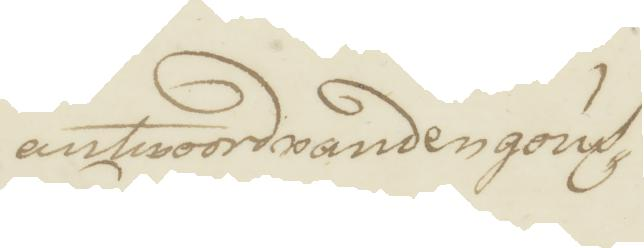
antwoord vanden gouver„
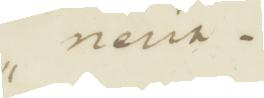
„neur
